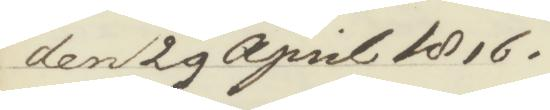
den 29 April 1816.
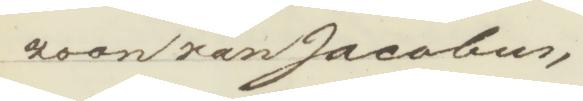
zoon van Jacobus,
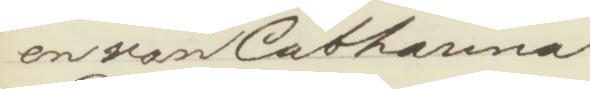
en van Catharina
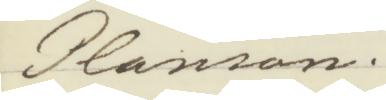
Hanson
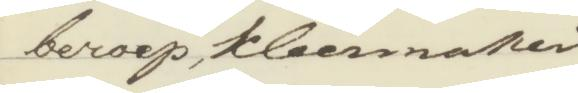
beroep, kleermaker
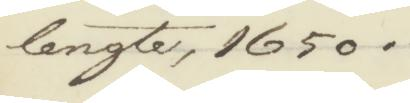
lengte, 1650,
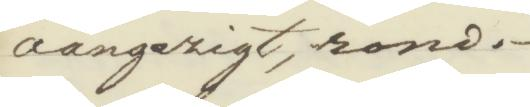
aangezigt, rond.
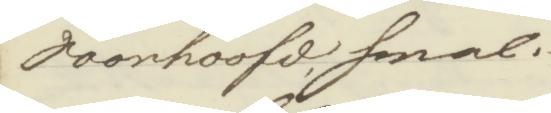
voorhoofd, smal.
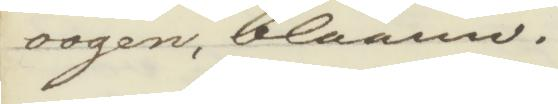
oogen, blaauw.
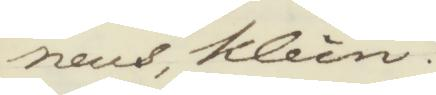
neus, klein.
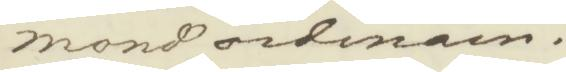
mond, ordinair.
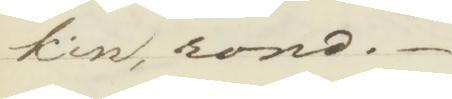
kin, rond.
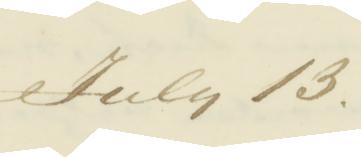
July 13.
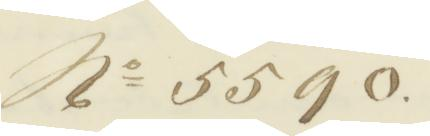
N=o 5590.
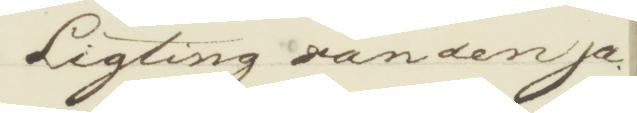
Ligting van den ja.
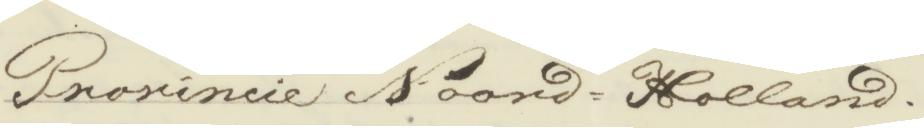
Provincie Noord=Holland.
